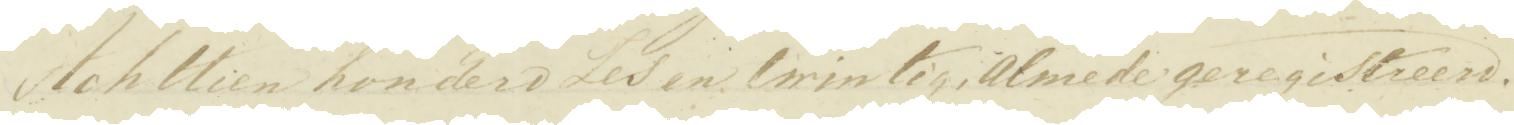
Achttien honderd zes en twintig, almede geregistreerd.
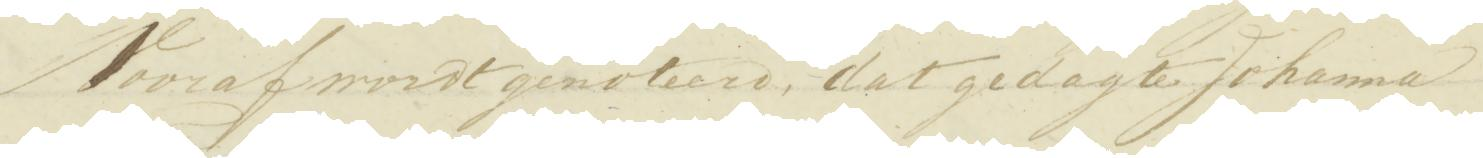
Vooraf wordt genoteerd, dat gedagte Johanna
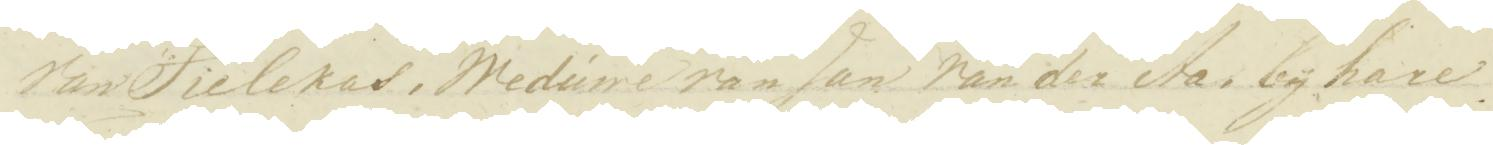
van Tielekas, Weduwe van Jan van der Aa, bij hare
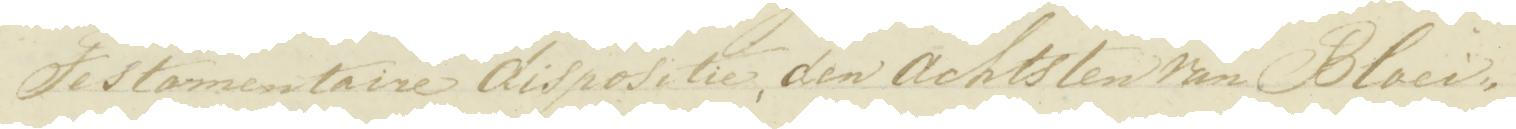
Testamentaire dispositie, den achtsten van Bloei„
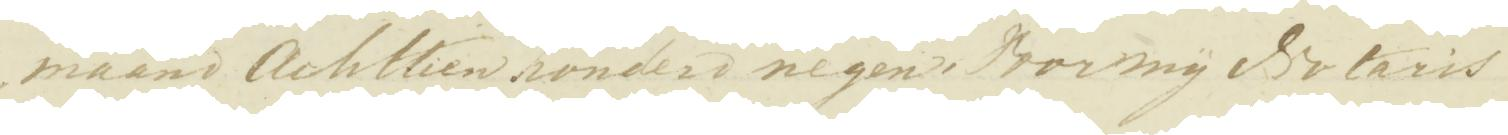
„maand Achttien honderd negen, Voor mij Notaris
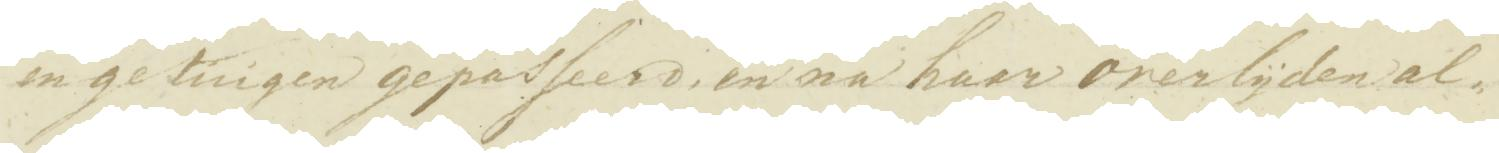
in getuigen gepasseerd, en na haar overlijden al„
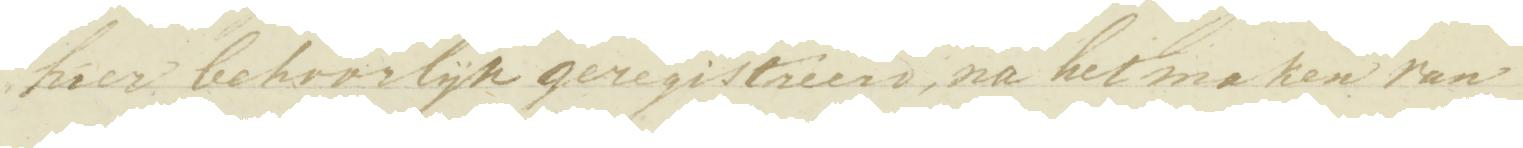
hier behoorlijk geregistreerd, na het maken van
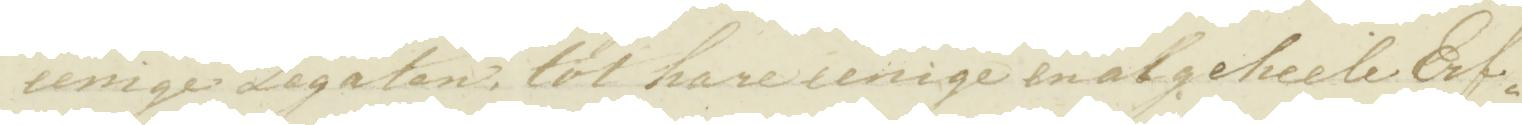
eenige Legaten, tot hare eenige en algeheele Erf„
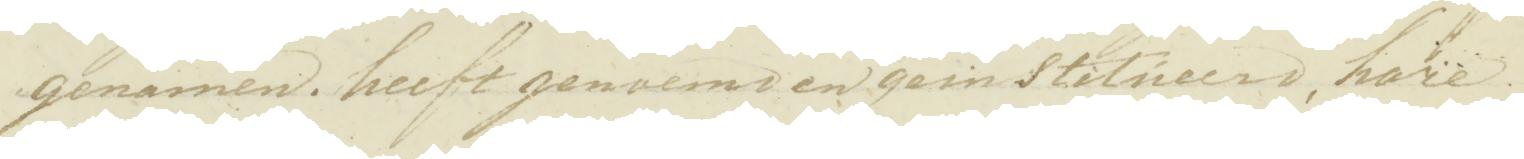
„genamen, heeft genoemd en geinstitueerd, hare
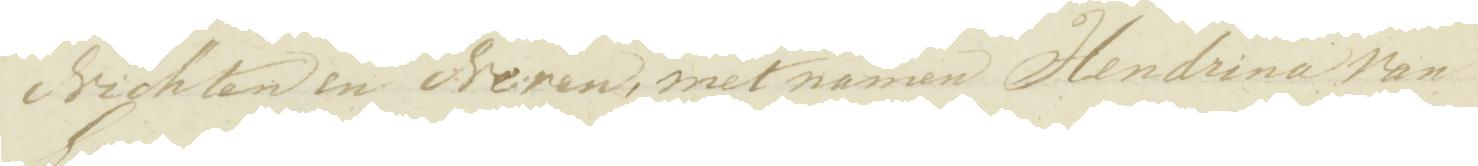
Nichten en Neven, met namen Hendrina van
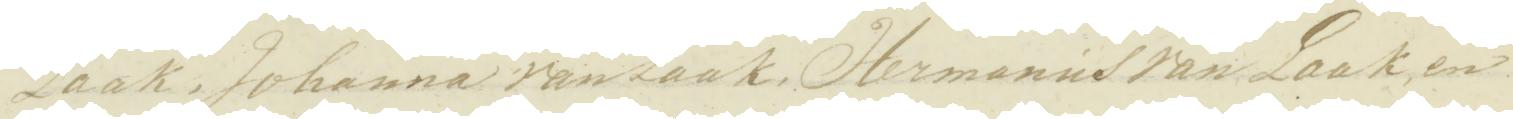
Laak, Johanna van Laak, Hermanus van Laak en
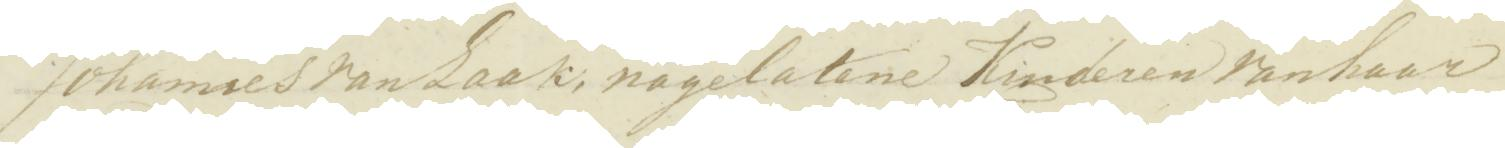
Johannes van Laak, nagelatene kinderen van haar
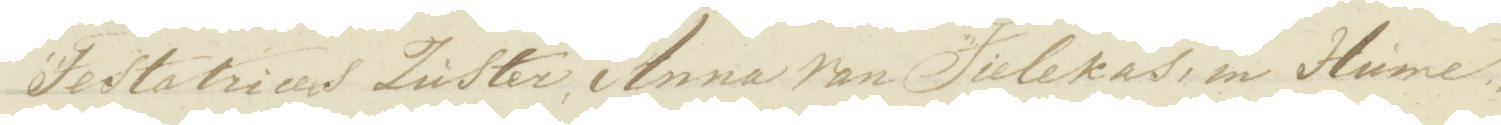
Testatrice Zuster, Anna van Tielekas, in Huwe„
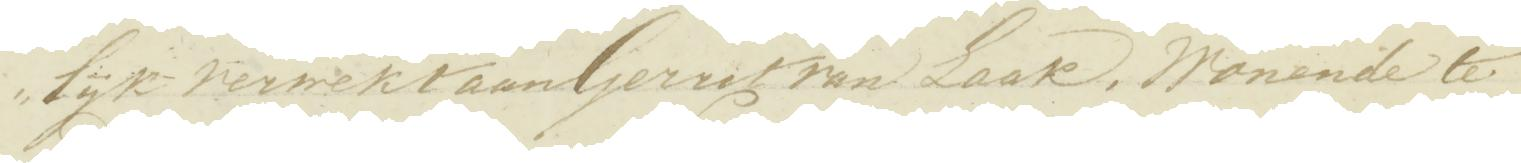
„lijk verwekt aan Gerrit van Laak, Wonende te
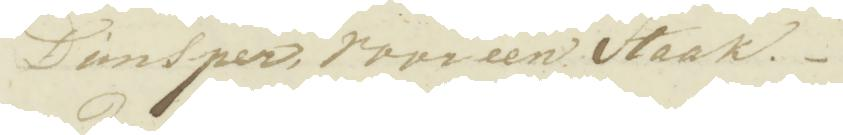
Dunsper, voor een staak.
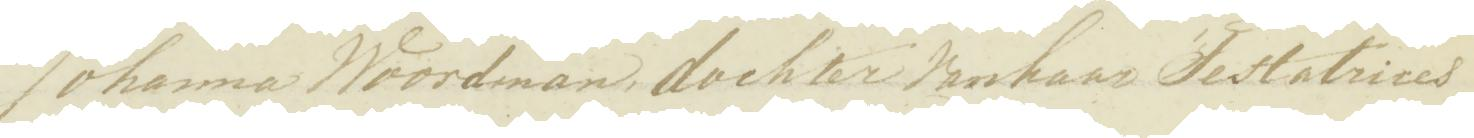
Johanna Woordman, dochter van haar Testatrices
